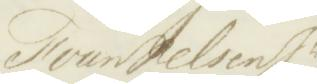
F van Velsen J
